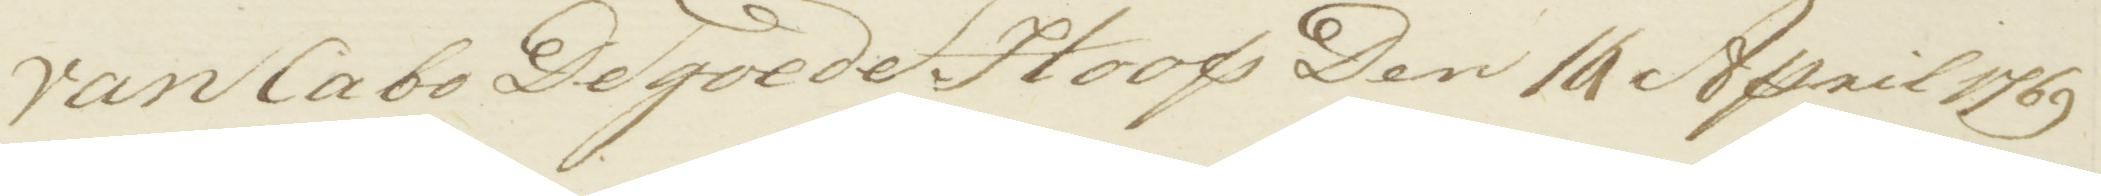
van Cabo De goede Hoop Den 14 April 1769
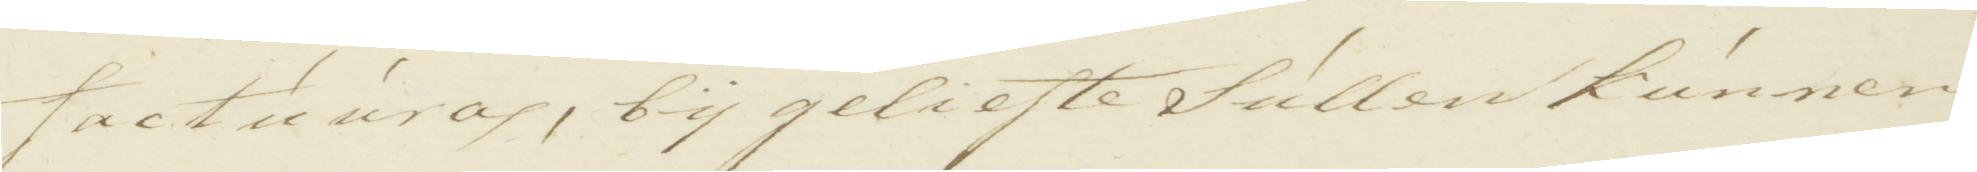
factuura, bij geliefte sullen kunnen
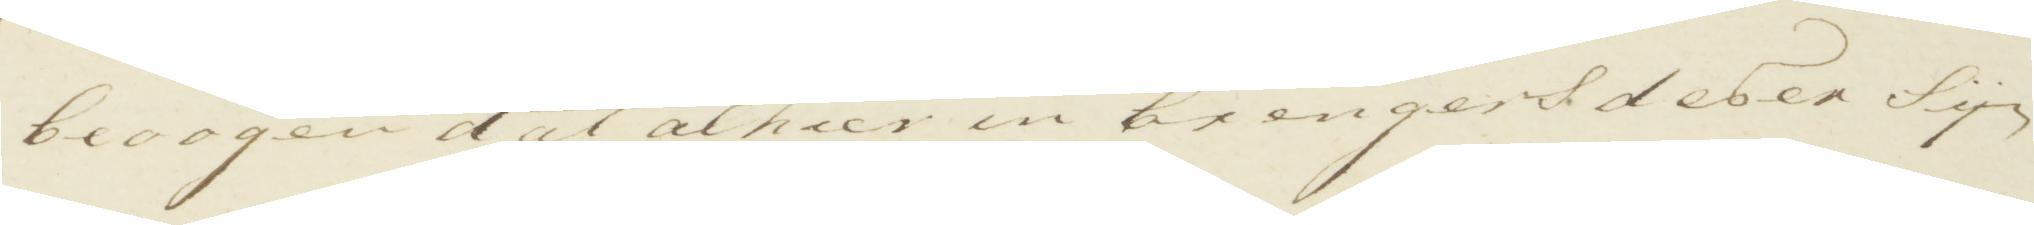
beoogen dat alhier in brengers deser sijn
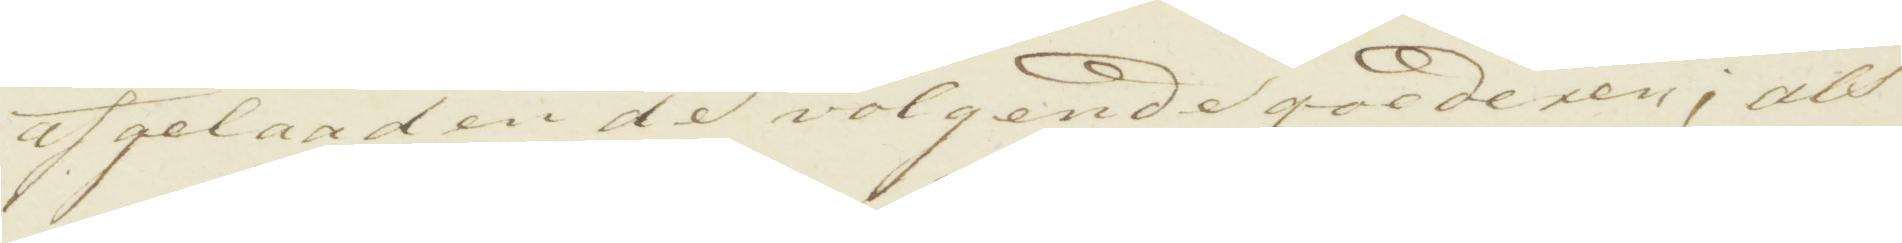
afgelaaden de volgende goederen; als
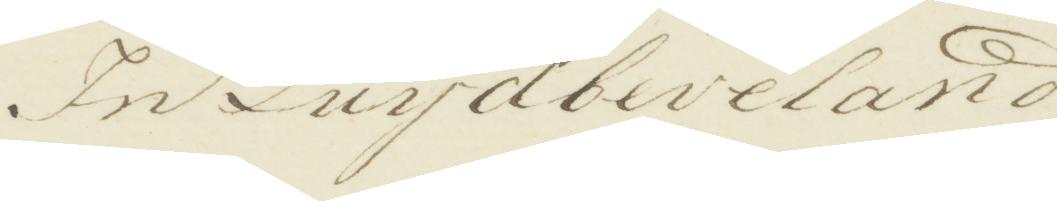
In Zuijdbeveland
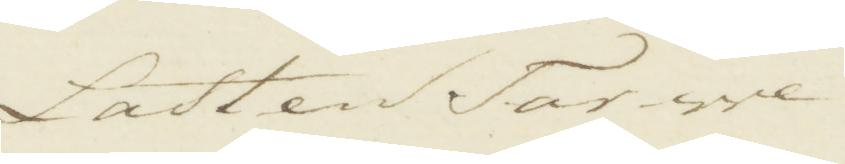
Lasten Tarwe
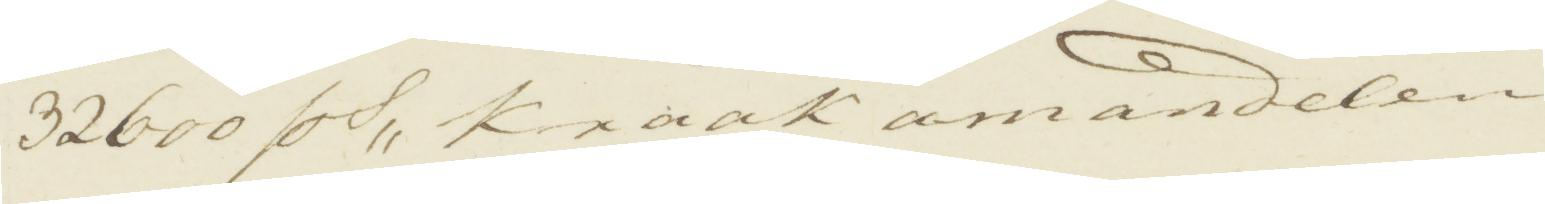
32600 p„s kraak amandelen
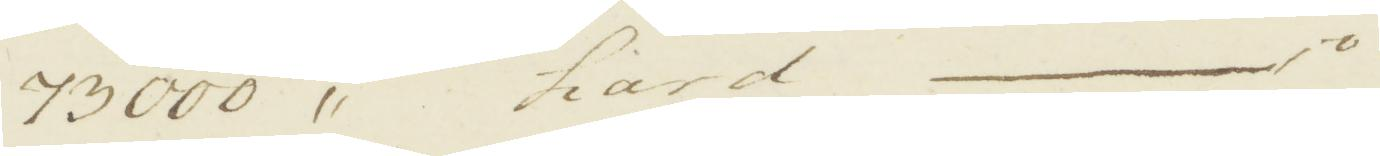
73000 „ hard _o
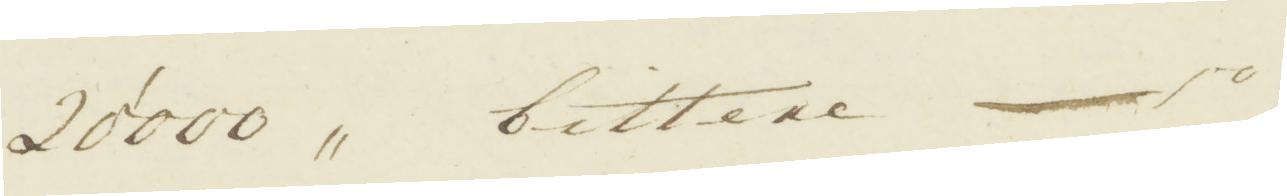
20'000 „ bittere _o
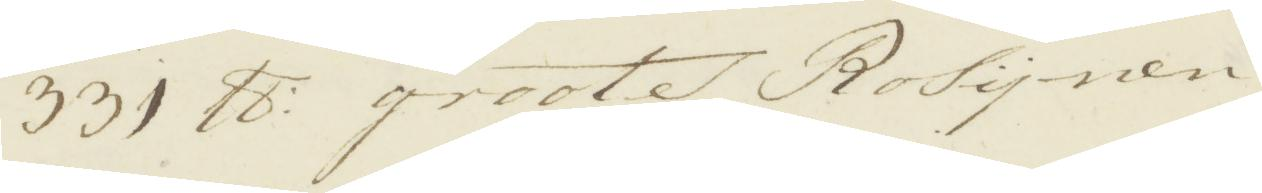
331 lb: groote Rosijnen
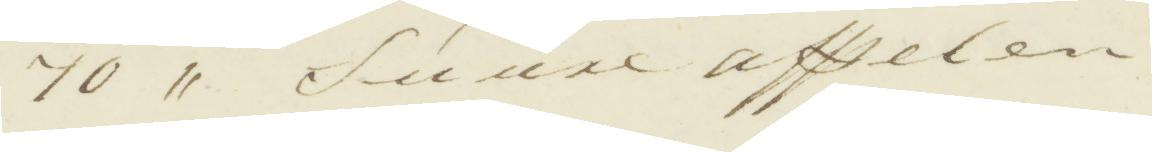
70 „ suure appelen
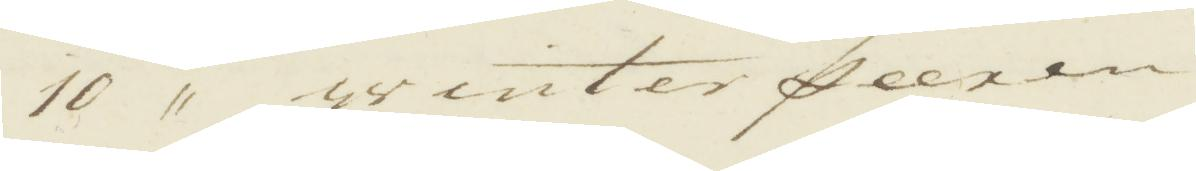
10 „ winter peeren
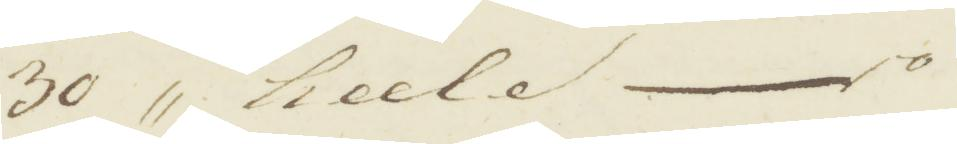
30 „ heele _o
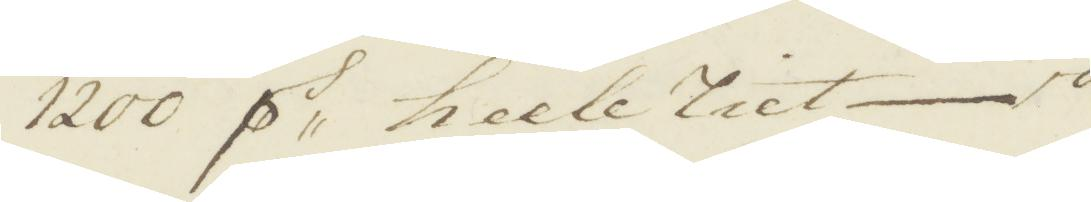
1200 p„s heele riet _o
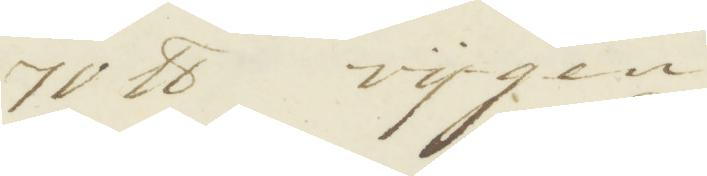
70 lb vijgen
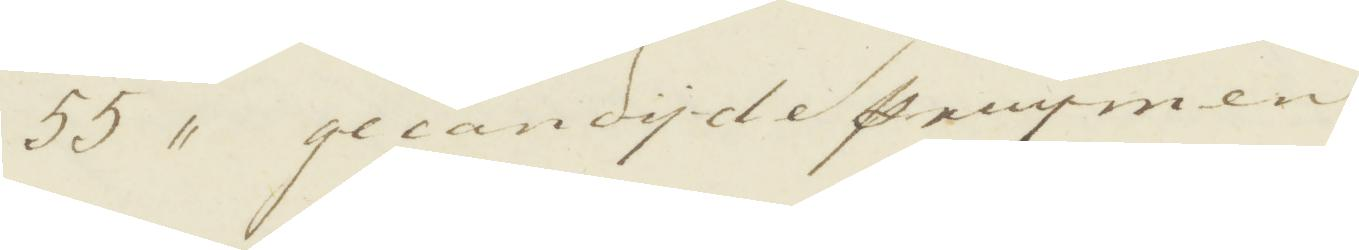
55 „ gecandijde pruijmen
